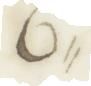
6„
